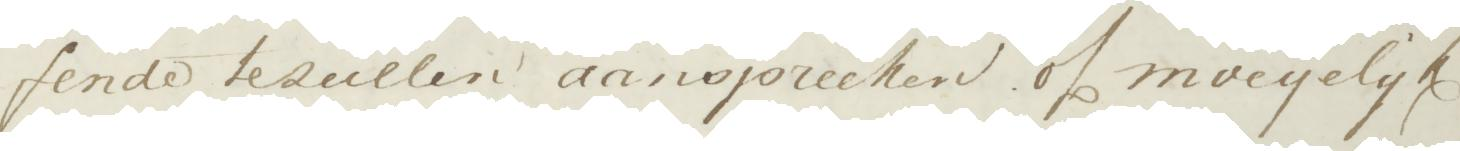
fende te zullen aanspreeken of moeijelijk
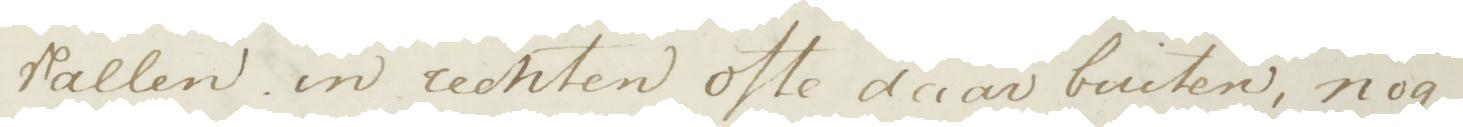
vallen in rechten ofte daar buiten, nog
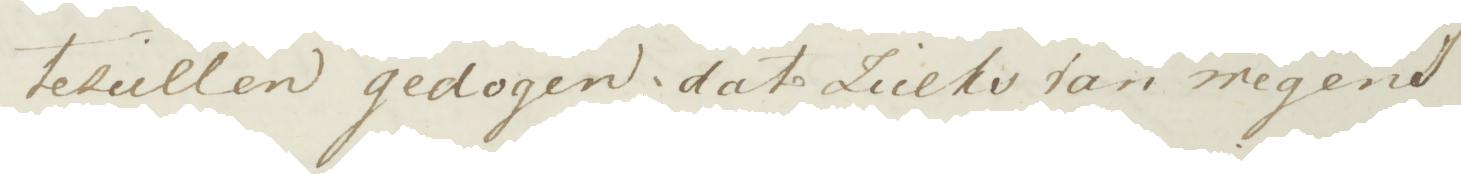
tezullen gedogen, dat zulks van wegens
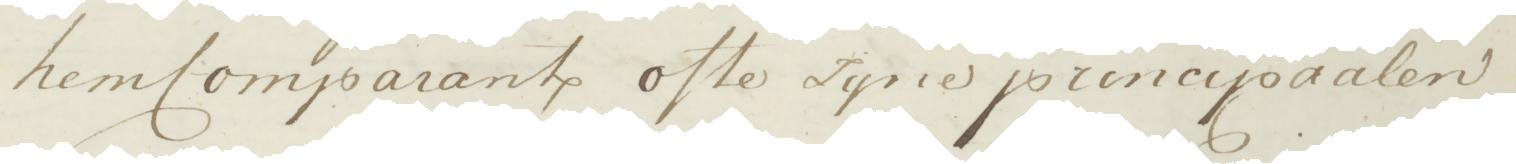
hem Comparant ofte zyne principaalen
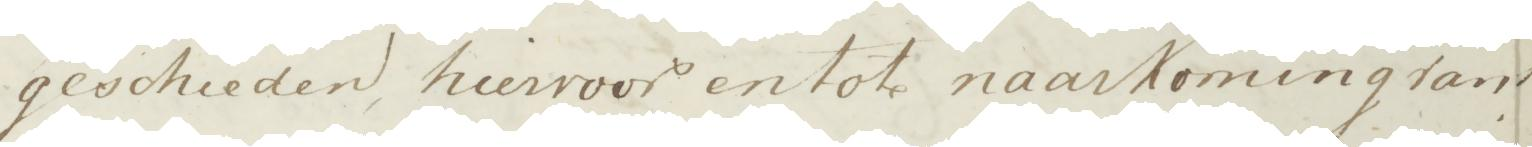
geschieden, hiervoor en tot naarkoming van
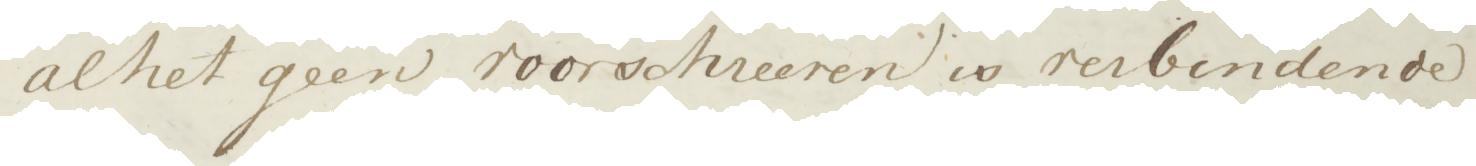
al het geen voorschreeven is verbindende
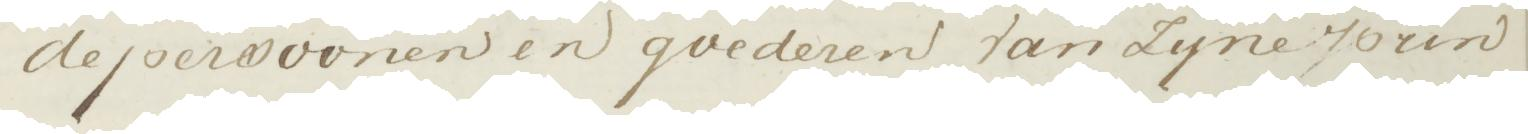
de persoonen en goederen van zyne prin
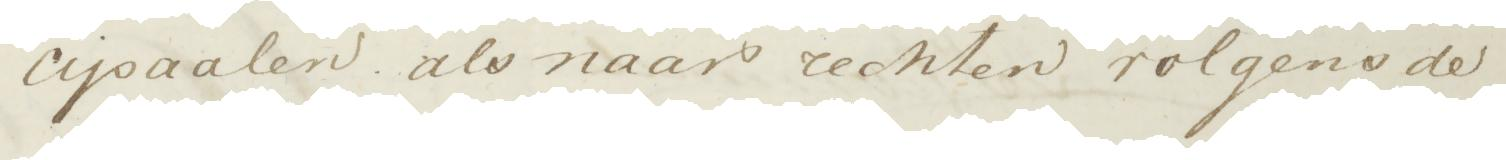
cipaalen. als naar rechten volgens de
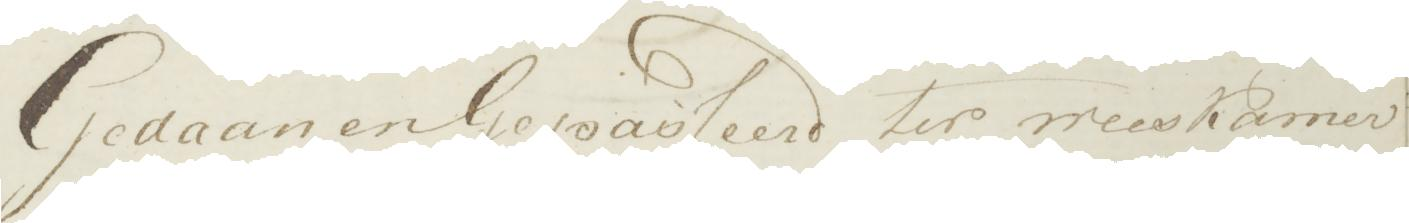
Gedaan en Gepasseerd ter weeskamer
